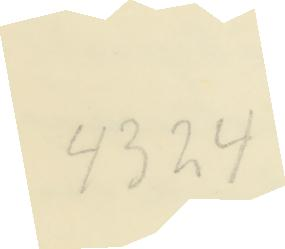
4324
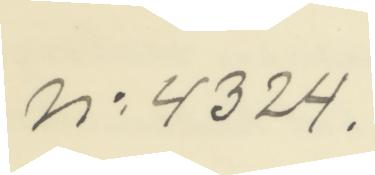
N.o 4324.
